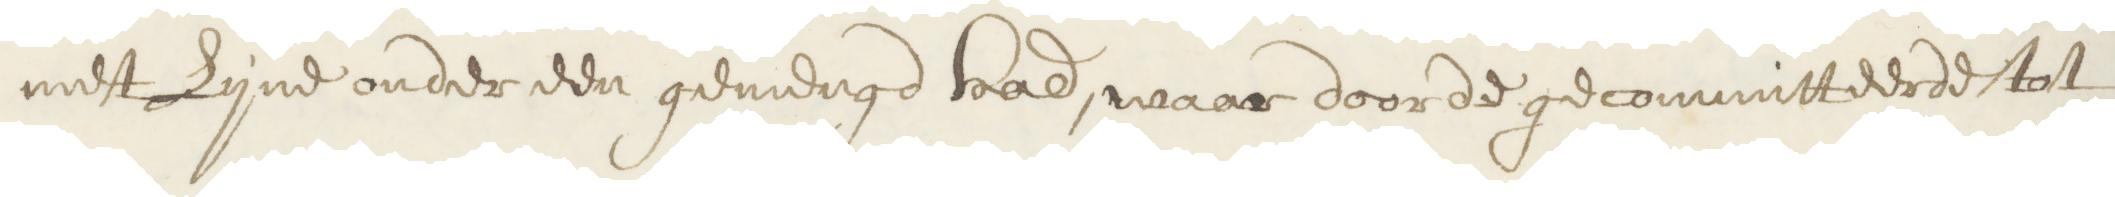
met zijne onder een gemengd had, waar door de gecommitteerde tot
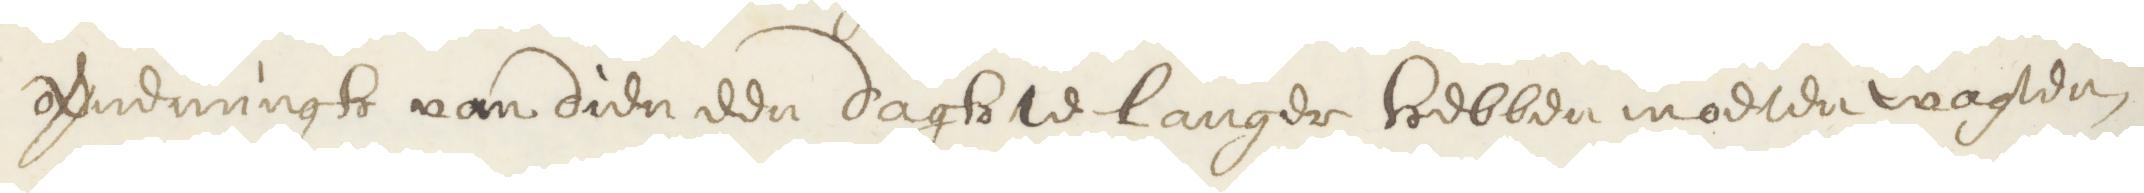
overnemingh van dien een dagh te langer hebben moeten wagten,
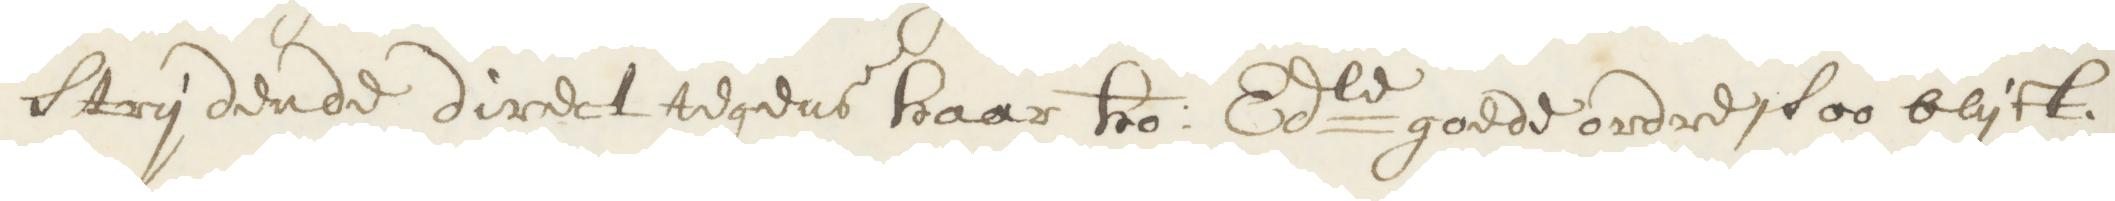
strijdende direct tegens haar Ho: Ed=le goede ordre, soo blijft.
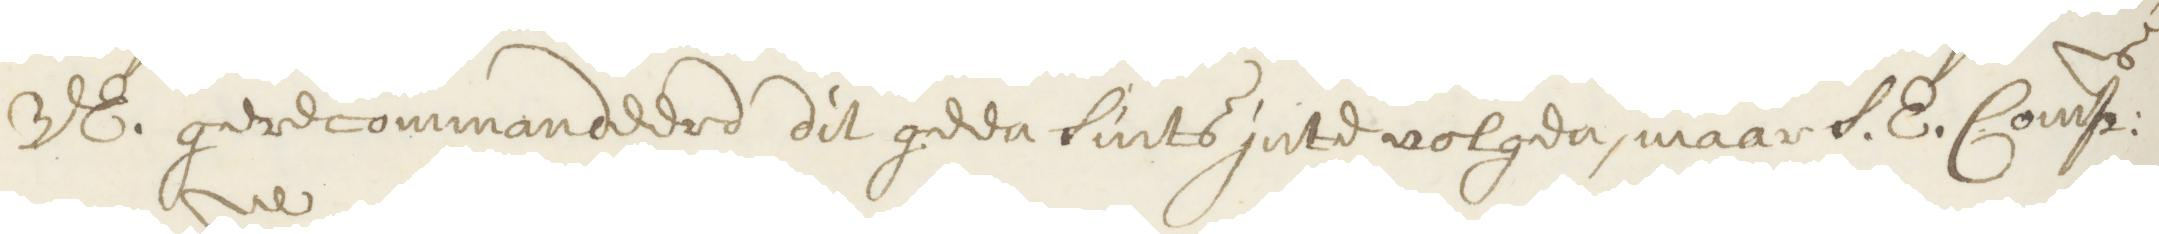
VE. gerecommandeerd dit geen sints jnte volgen, maar s.E.Comp:s
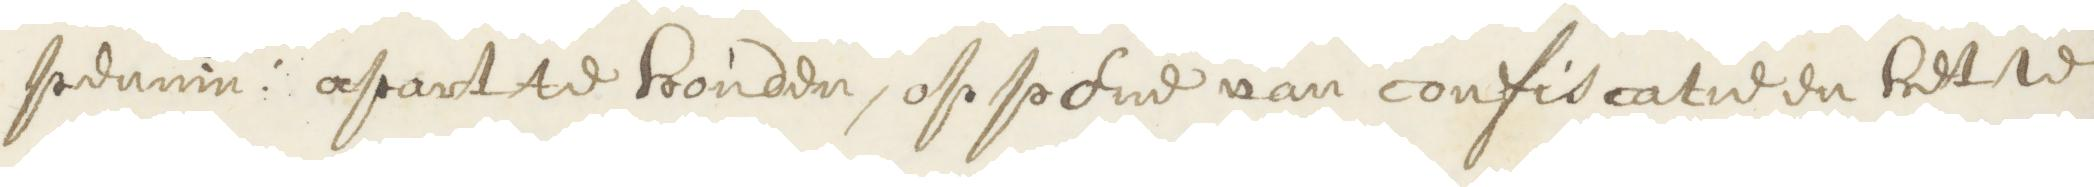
pennin: apart te houden, op pene van confiscatie en het te
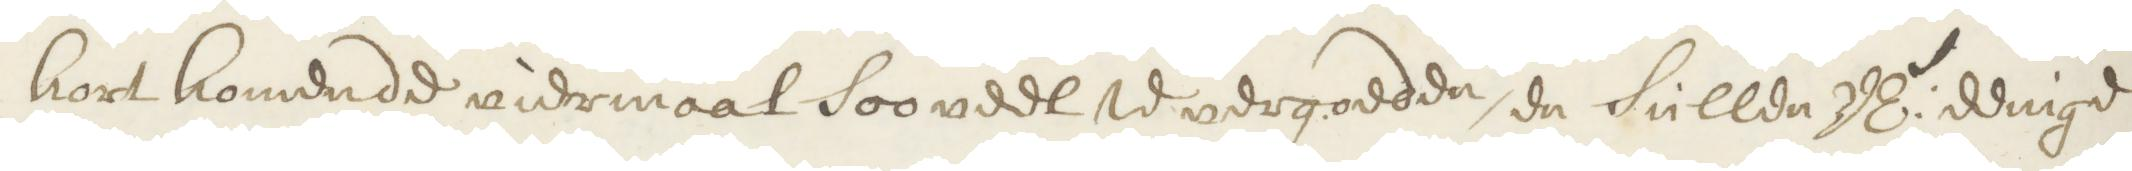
kort komende viermaal soo veel te vergoeden, en sullen VE:s eenige
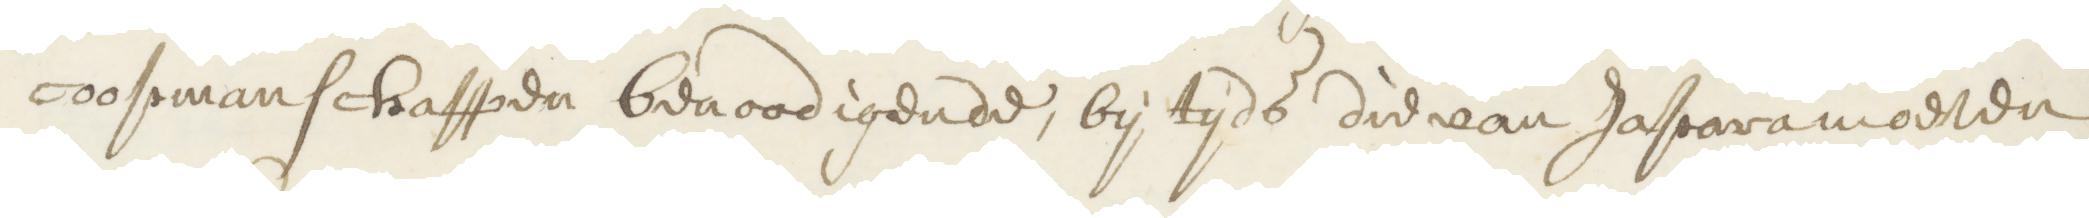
coopmanschappen benoodigende, bij tijds die van Japara moeten
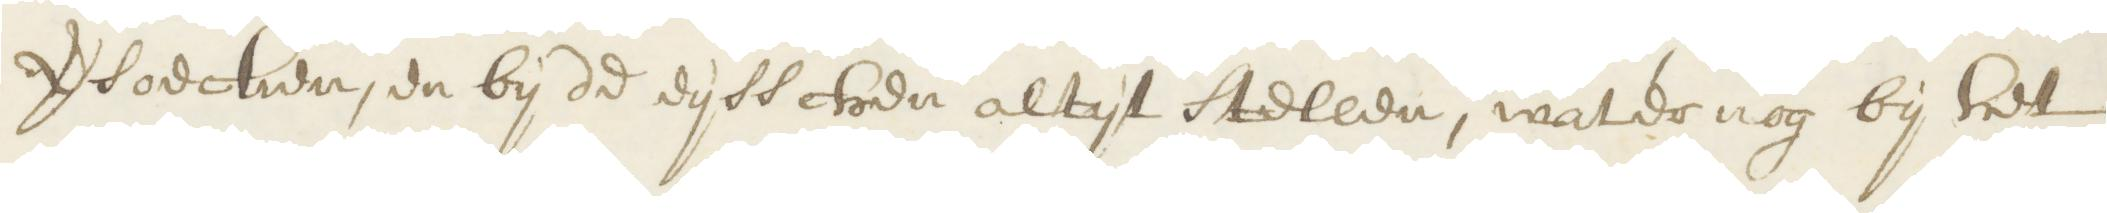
versoecken, en bij de eijsschen altijt stellen, wat er nog bij het
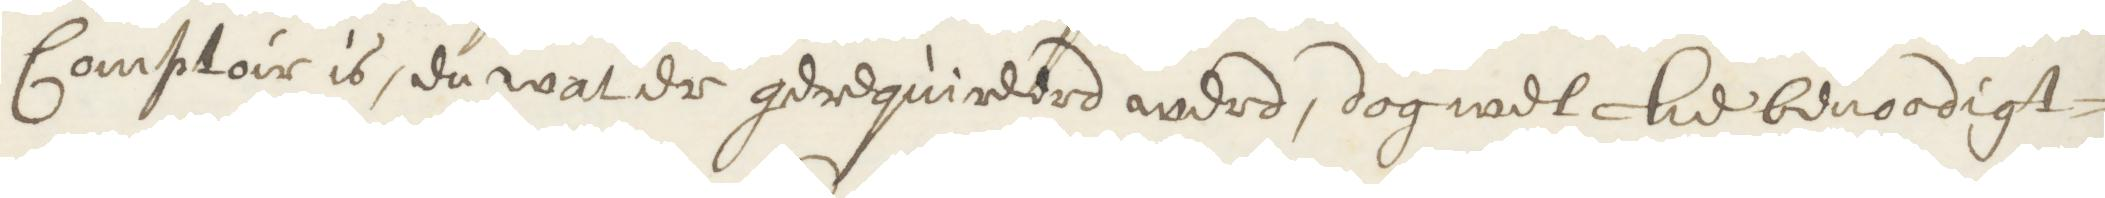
Comptoir is, en wat er gerequireerd werd, dog welcke benoodigt=
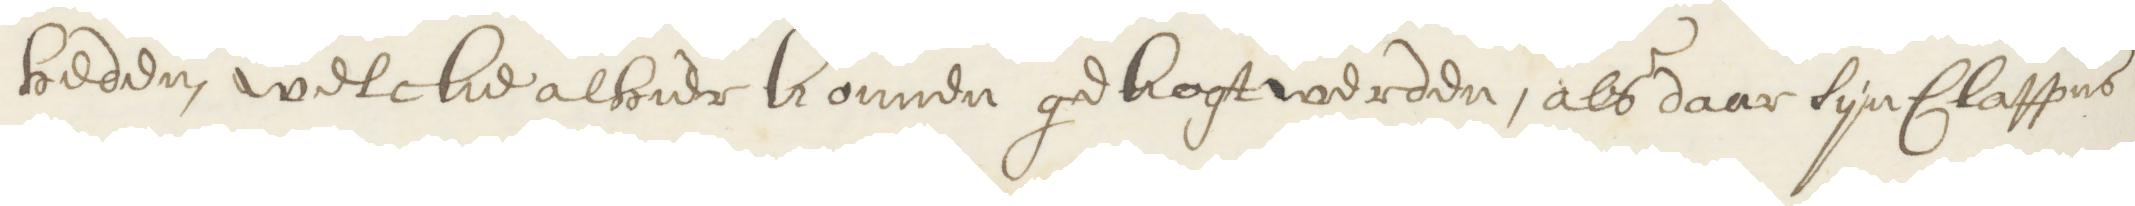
heden, welcke alhier konnen gekogt werden, als daar sijn Clappus
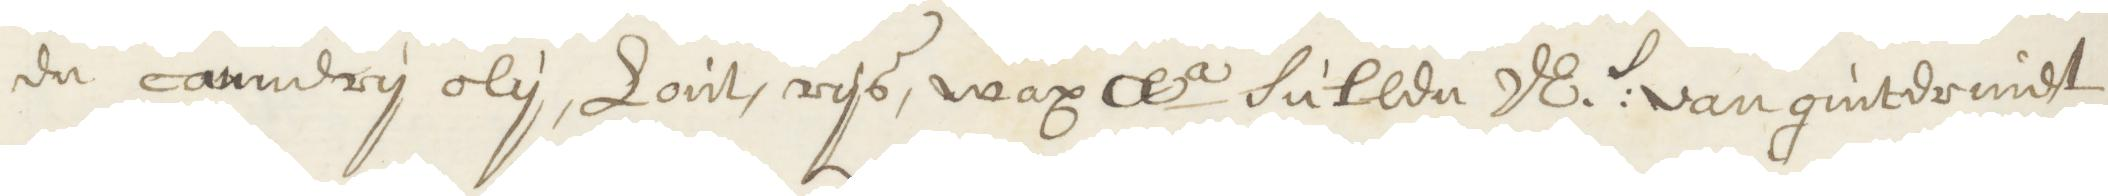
en cannerij olij, zout, rijs, wax &_a sullen VE:s van ginter niet
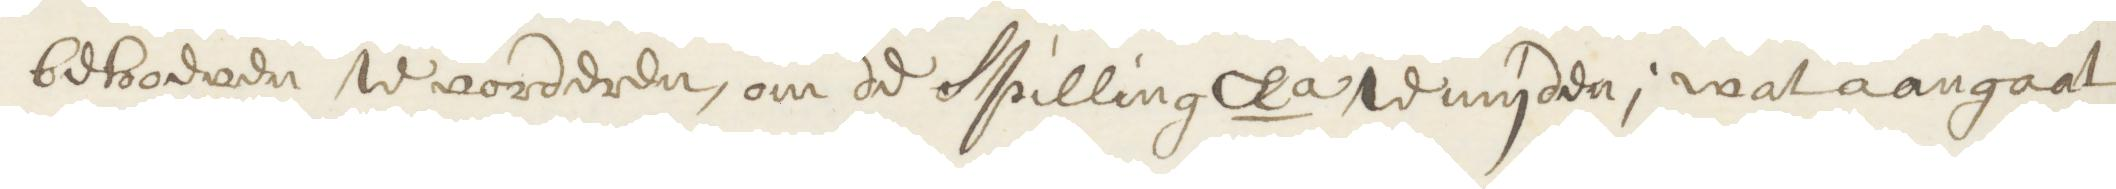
behoeven te vorderen, om de spilling &_a te mijden; wat aangaat
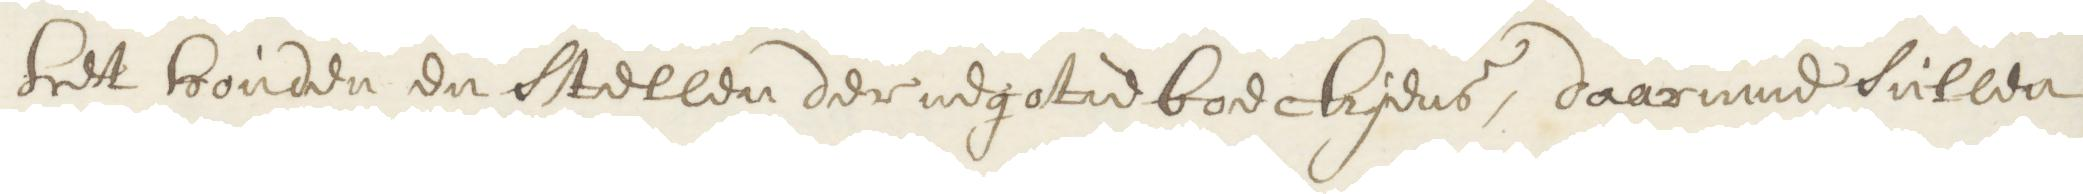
het houden en stellen der negotie boeckjens, daarinne sullen
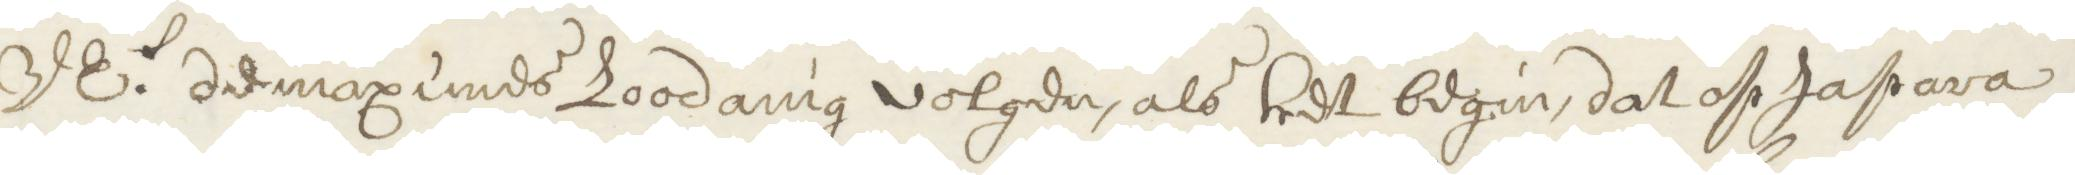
VE.s de maximes zoodanig volgen, als het begin, dat op Japara
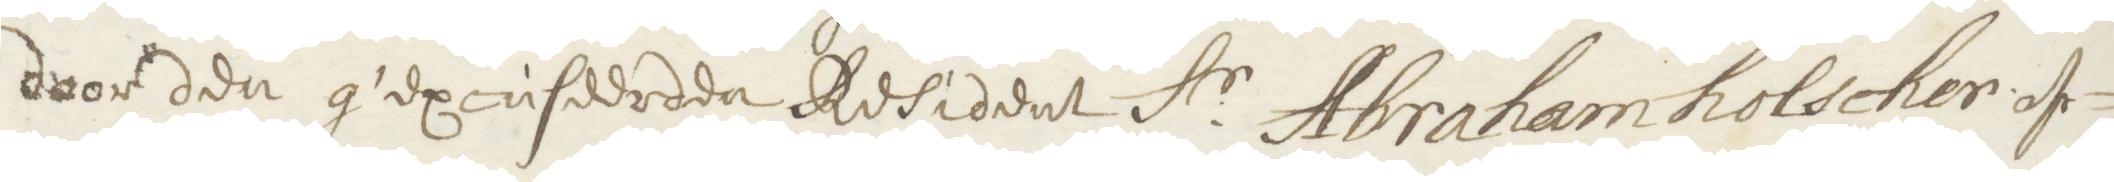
door den g’excuseerden Resident s:r Abraham holscher op
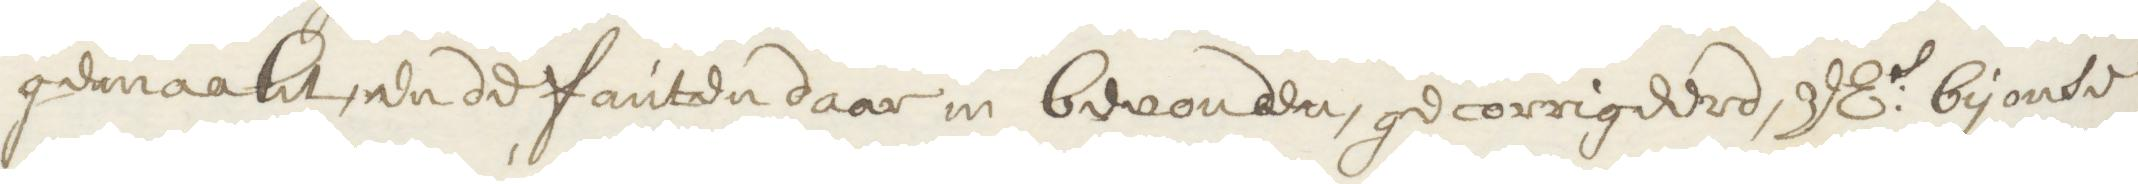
gemaakt, en de fauten daar in bevonden, gecorrigeerd, VE:s bij onse
